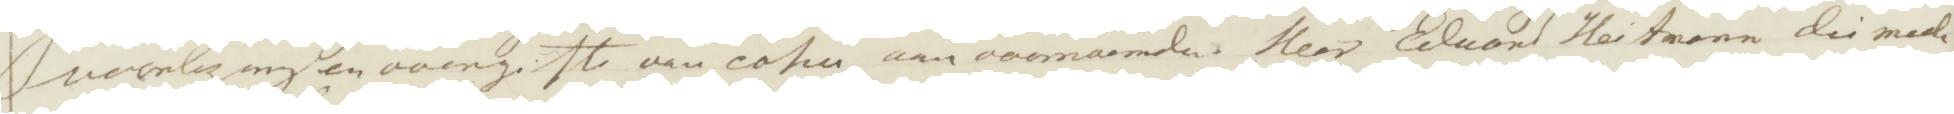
voorlezing en overgifte van copie aan voornoemden Heer Eduard Heitmann die mede
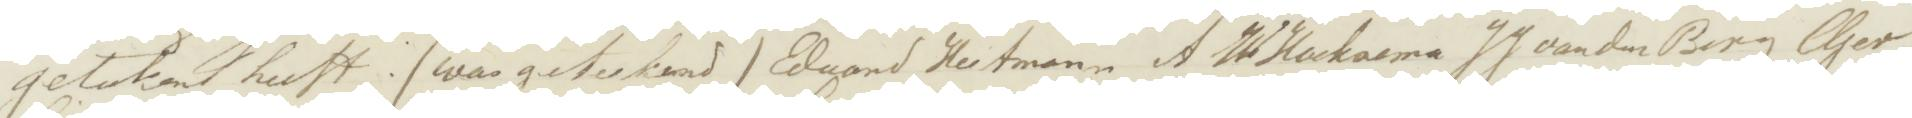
getekend heeft. (was geteekend) Eduard Heitmann A W Haeksema JJ van den Berg C Ger
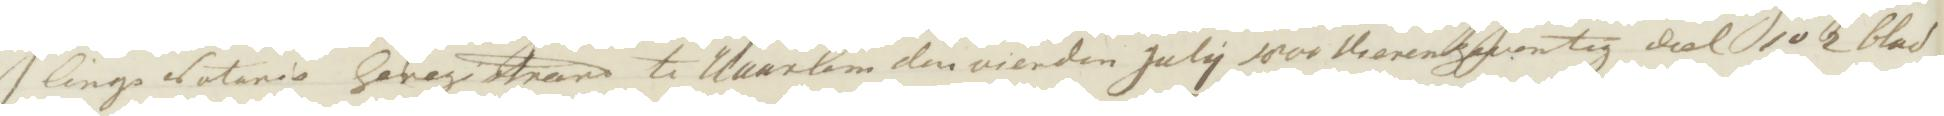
lings Notaris Geregistreerd te Haarlem den vierden Julij 1800 Vierenzeventig deel 102 blad
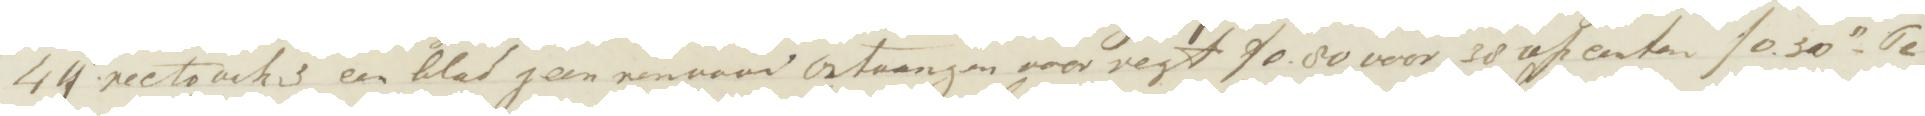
49 recto vak 3 een blad geen renvooi ontvangen voor regt ƒ0. 80 voor 38 op centen ƒ 0.30-" Te
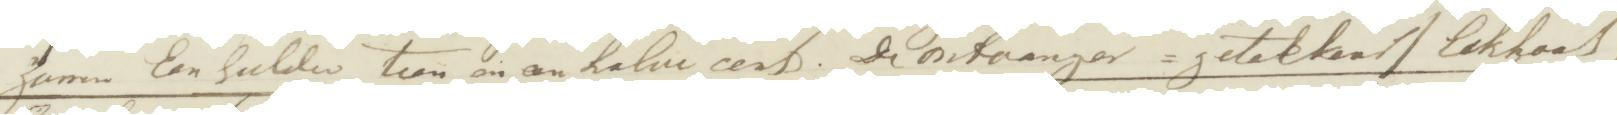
zamen Een Gulden tien en een halve cent. De ontvanger = geteekend / Eekhout
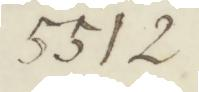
5512
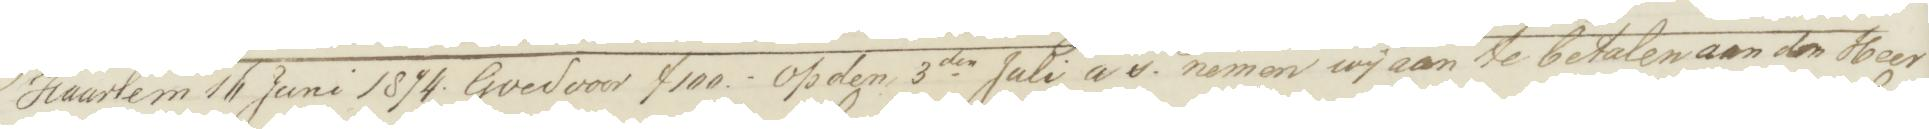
Haarlem 14 Juni 1874. Goed voor ƒ 100.- op den 3-den Juli a s. nemen wij aan te betalen aan den Heer
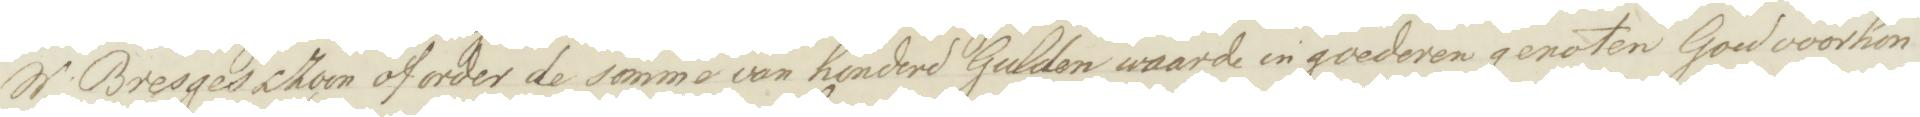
W. Bresges & Zoon of order de somme van honderd Gulden waarde in goederen genoten Goed voor hon
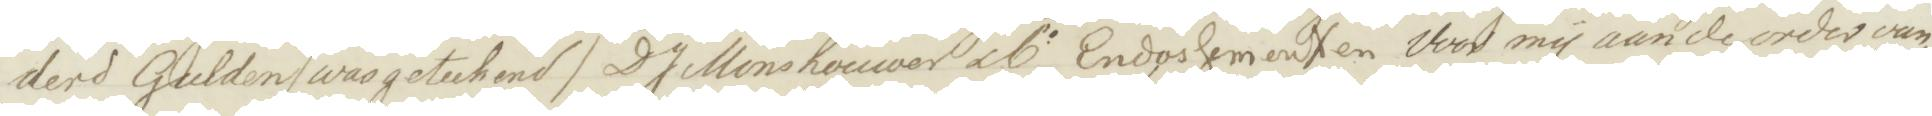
derd Gulden (was geteekend) D J Monshouwer & C.o Endossementen voor mij aan de order van
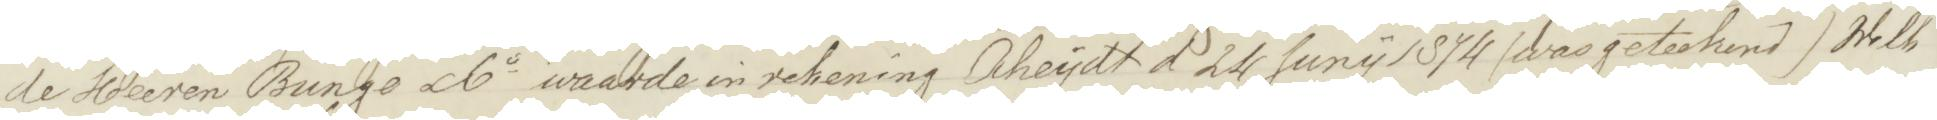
de Heeren Bunge & C-o waarde in rekening Aheijdt d 24 Junij 1874 (was geteekend) Wilh
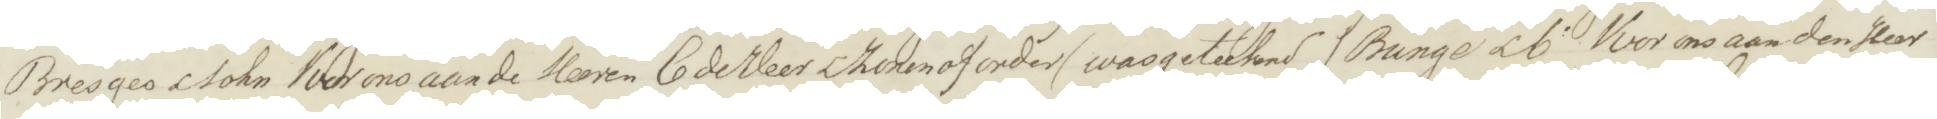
Bresges & sohn Voor ons aan de Heeren C de Veer & Zonen of order (was geteekend) Bunge & C.o Voor ons aan den Heer
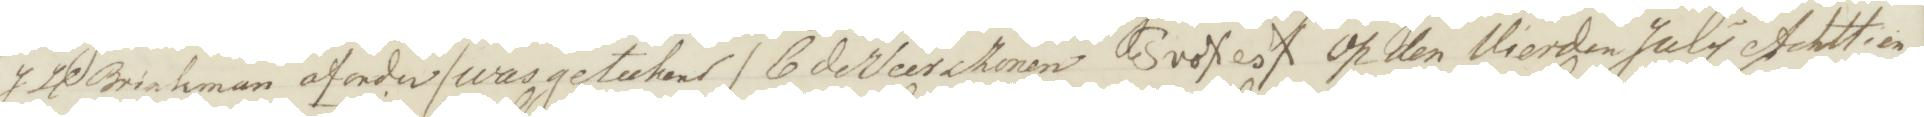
J: H Brinkman of order (was geteekend) C de Veer & Zonen Protest Op den Vierden Julij Achttien
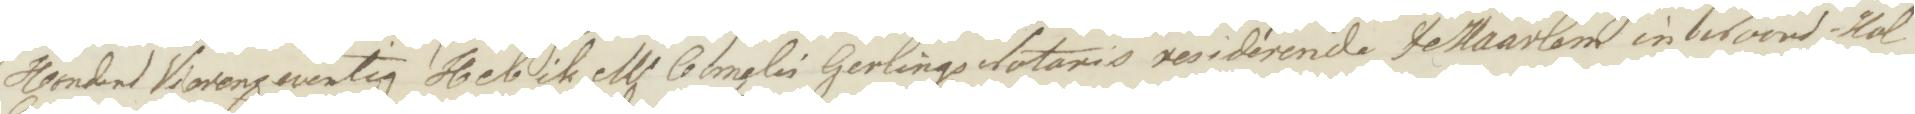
Honderd Vierenzeventig Heb ik Mr Cornelis Gerlings Notaris residerende te Haarlem in Noord-Hol
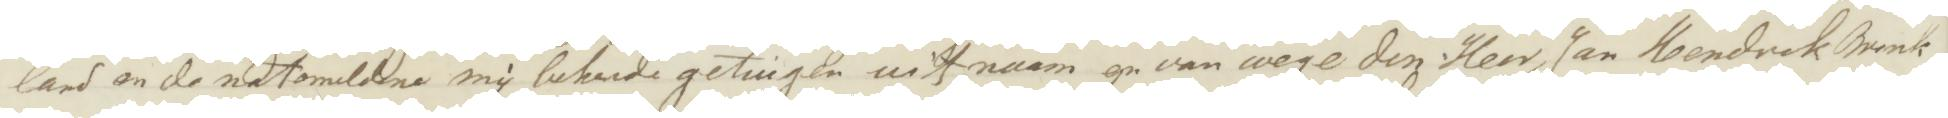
land en de natemeldene mij bekende getuigen uit naam en van wege den Heer Jan Hendrik Brink
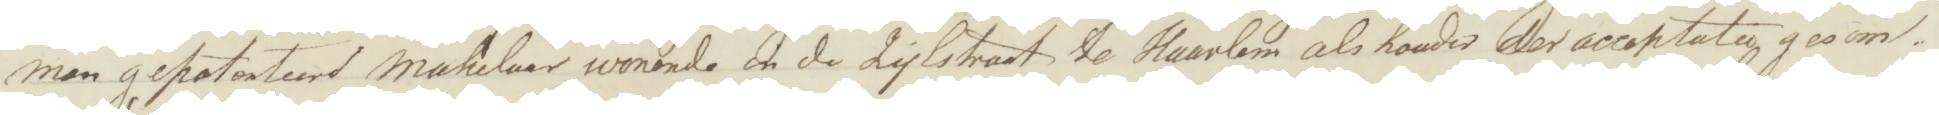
man gepatenteerd makelaar wonende in de Zijlstraat te Haarlem als houder der acceptatie gesom„
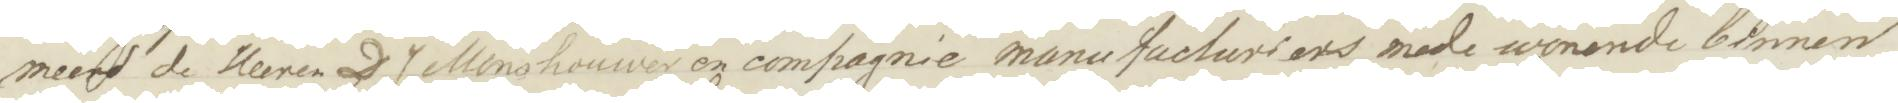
meerd de Heeren D J Monshouwer en compagnie manufacturiers mede wonende binnen
